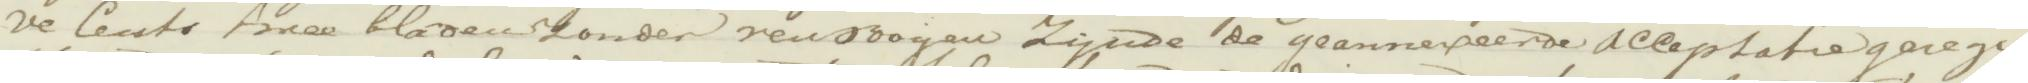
ve Cents twee bladen zonder renvooijen Zijnde de geannexeerde acceptatie geregi
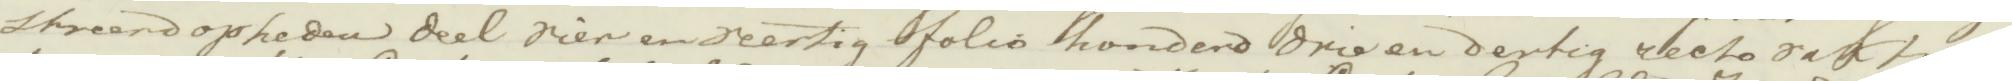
streerd op heden deel vier en veertig folio honderd drie en dertig recto vak twee
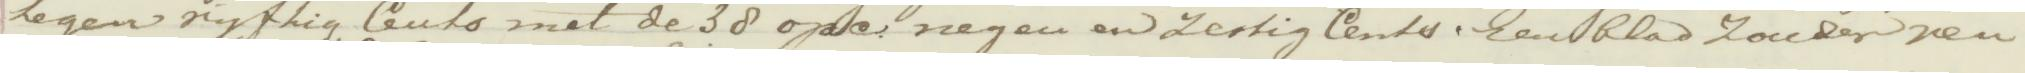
tegen vijftig Cents met de 38 opc. negen en Zestig Cents, Een blad zonder ren
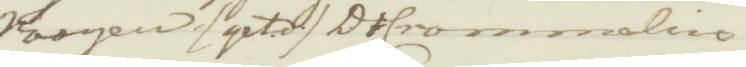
Vooyen (getd:) DF Crommelin
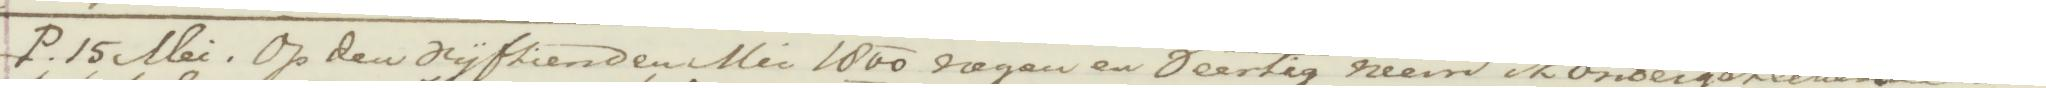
P. 15 Mei, Op den Vijftienden Mei 1800 negen en Veertig neem ik ondergeteekende aan
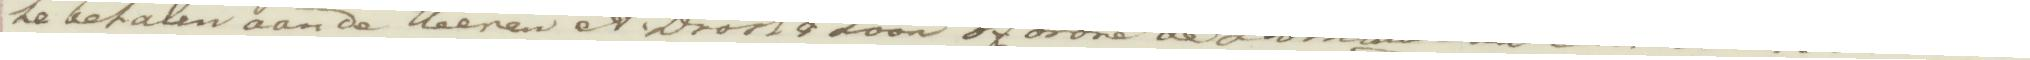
te betalen aan de Heeren A. Drost & Zoon of ordre de somma van Een honderd vier en
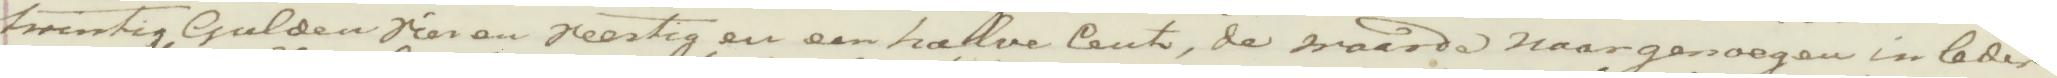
twintig Gulden Vier en Veertig en een halve Cent, de waarde naar genoegen in leder
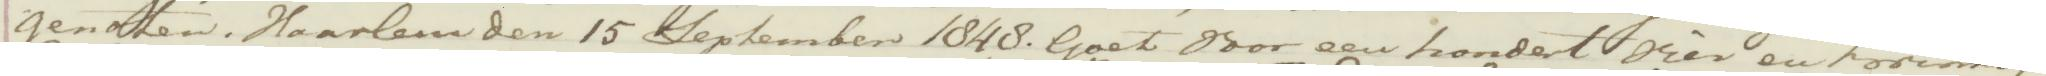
Genoten, Haarlem den 15 September 1848, Goet Voor een hondert vier en twintig
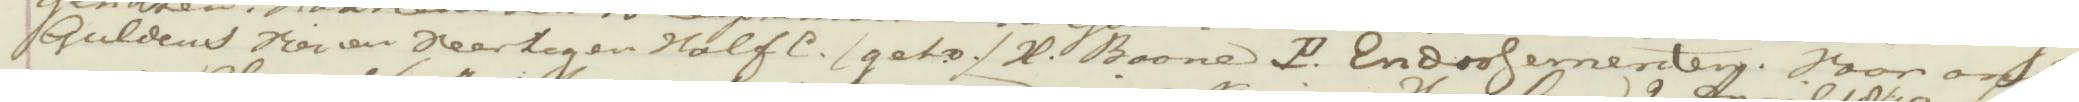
Guldens vier en veertig en Half C. (get.d.) H. Boone P. Endossementen Voor ons
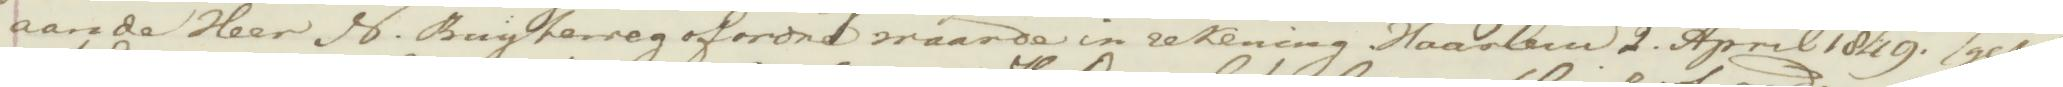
aan de Heer N. Buijteweg of ordre waarde in rekening Haarlem 2. April 1849. (get.d.)
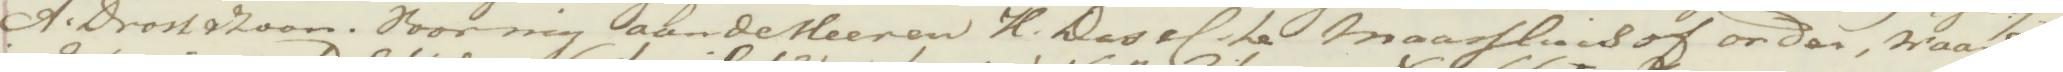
A. Drost & Zoon. Voor mij aan de Heeren H. Das & C. te Maassluis of order, waarde
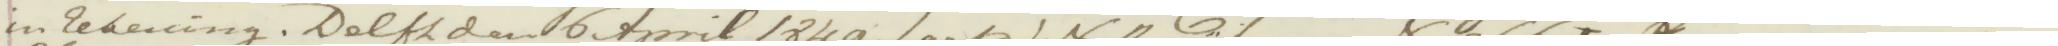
in Rekening. Delft den 6 April 1849. (get.d.) N Buijteweg N. 866 I: Voor ons aan den
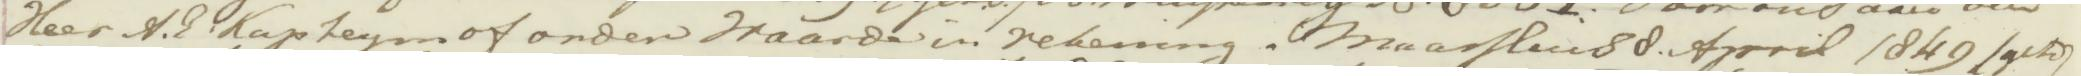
Heer A.E. Kapteym of onder Waarde in rekening, Maassluis 8. April 1849 (getd)
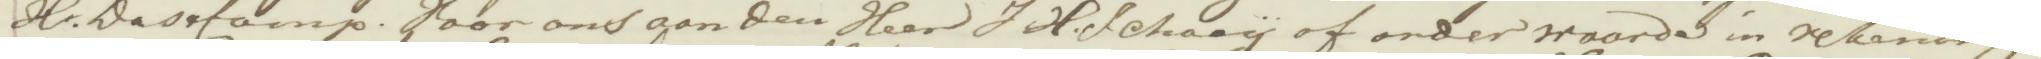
H. Das & Comp. Voor ons aan den Heer I H. Schaaij of order waarde in rekening
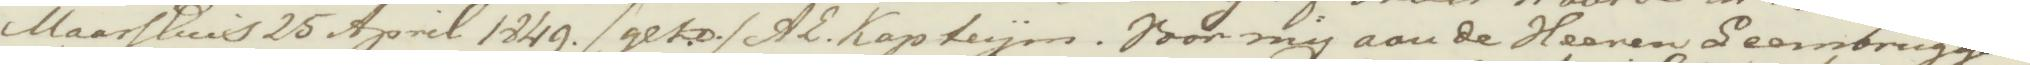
Maassluis 25 April 1849. (get.d.) A E. Kapteijm. Voor mij aan de Heeren Leembruggen
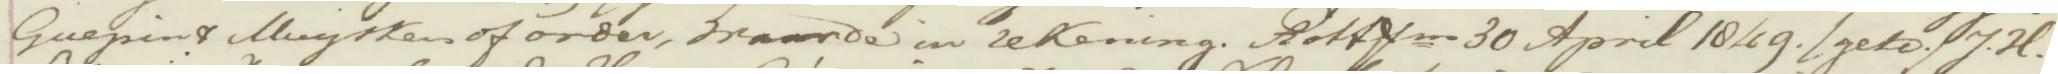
Guepin & Muijsken of order, Waarde in rekening. Rotts=m 30 April 1849. (getd.) J. H.
